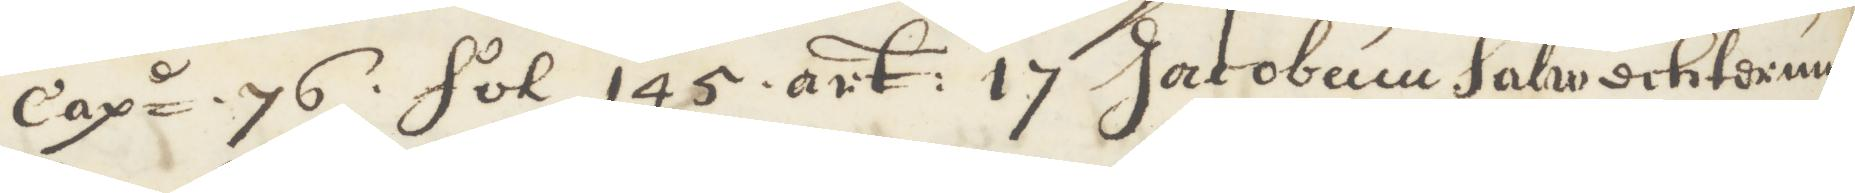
Cap=e . 76. fol 145. art: 17 Jacobeun Salwechter int
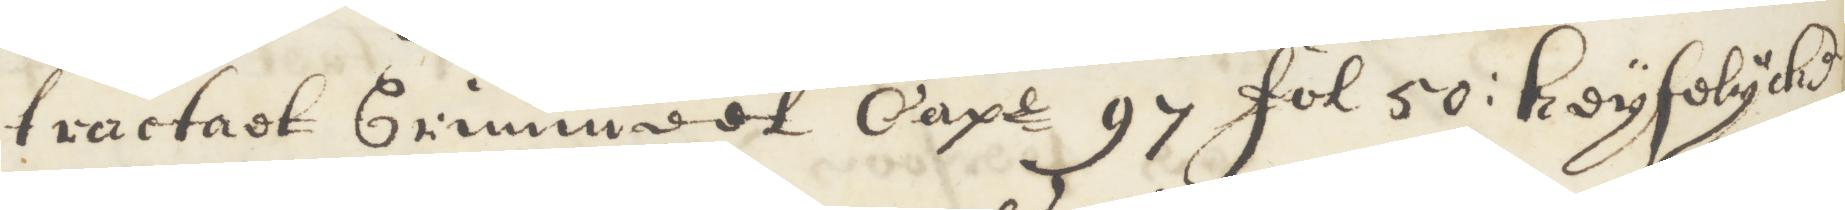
tractaet Crimineel Cap=l 97 fol 50: keijselijcke
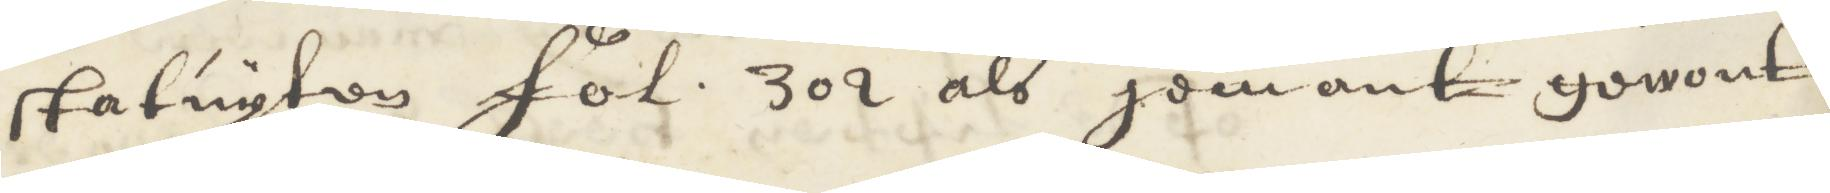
statuijten fol. 302 als jemant gewont
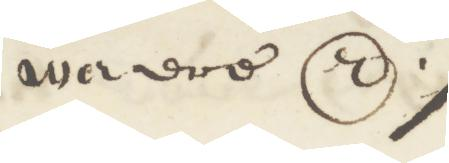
waere r.
